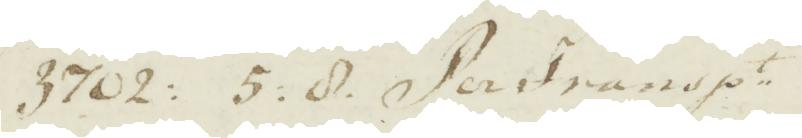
3702: 5: 8. Per Transp„t
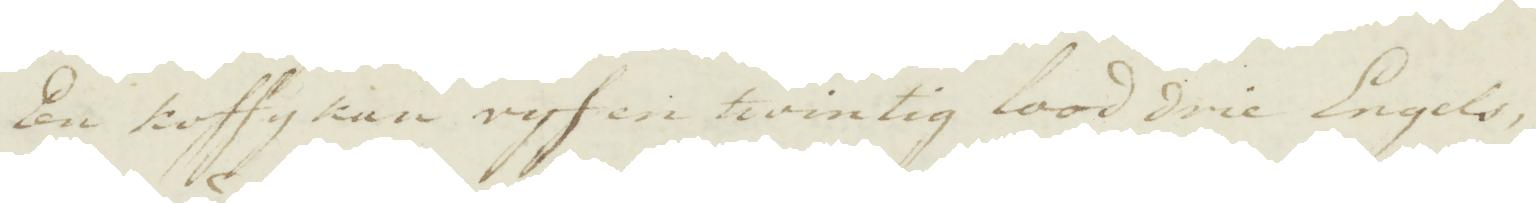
Een koffijkan vyfen twintig lood drie Engels,
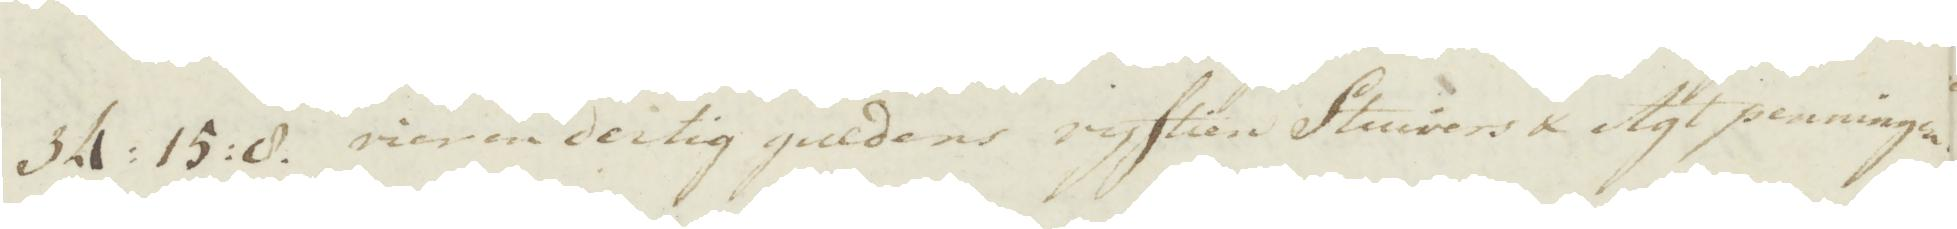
34:15:8: vier en dertig guldens vyftien Stuivers & Agt penningen.
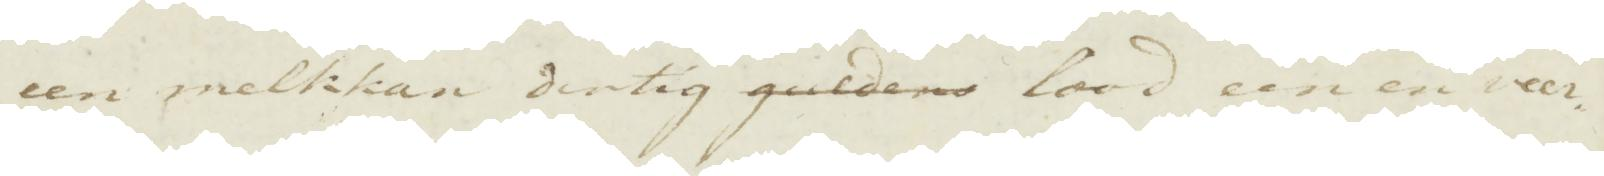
een melkkan dertig guldens lood een en veer„
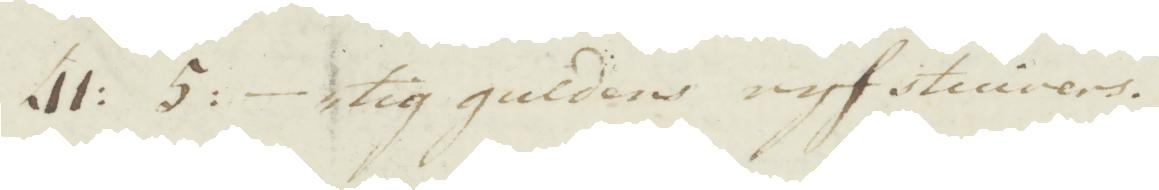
41: 5: — „tig guldens vyf stuivers.
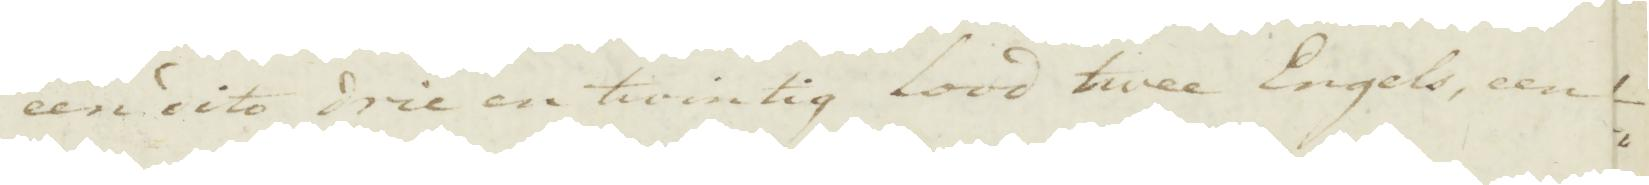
een dito drie en twintig lood twee Engels, een
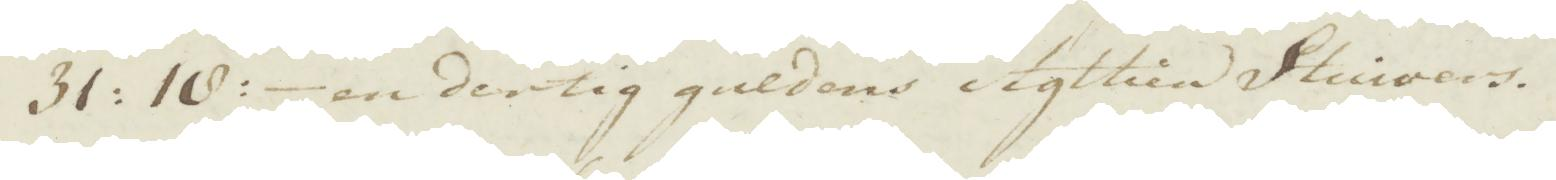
31:18: — en dertig guldens Agttien Stuivers.
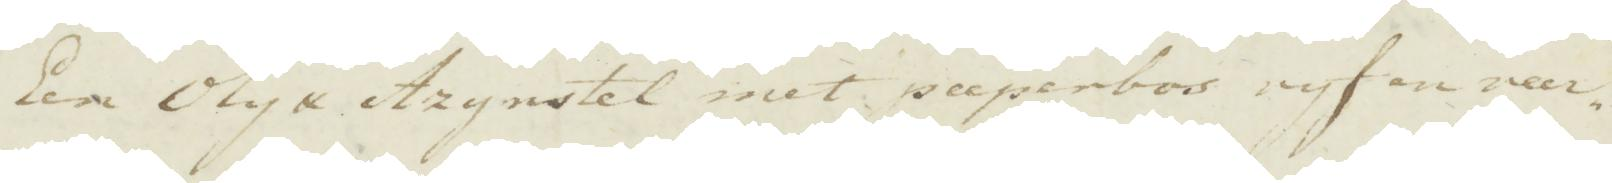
Een Oly & Azynstel met peeperbos vyf en veer„
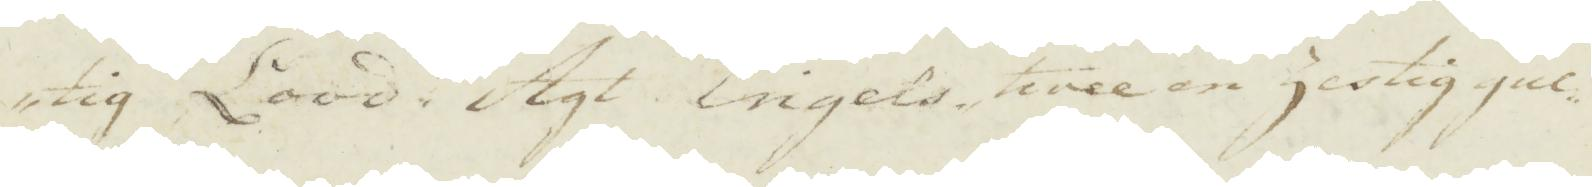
tig Lood. Agt Engels twee en zestig gul„
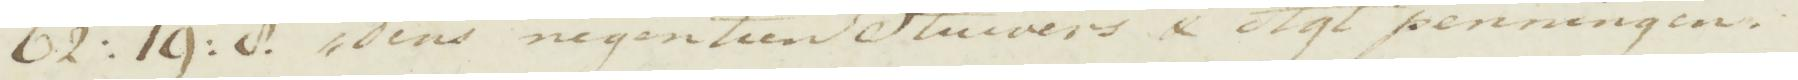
62:19:8. „dens negentien Stuivers & Agt penningen.
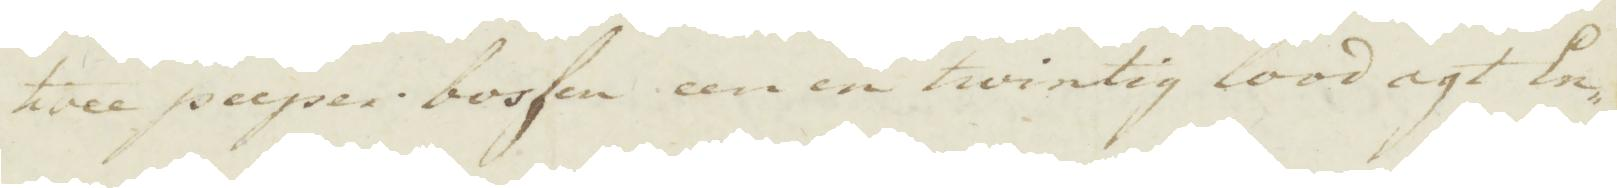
twee peeper bossen een en twintig lood agt En„
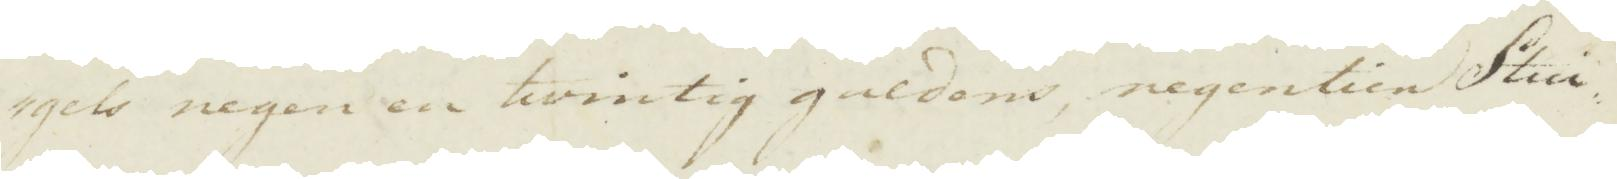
„gels negen en twintig guldens, negentien Stui„
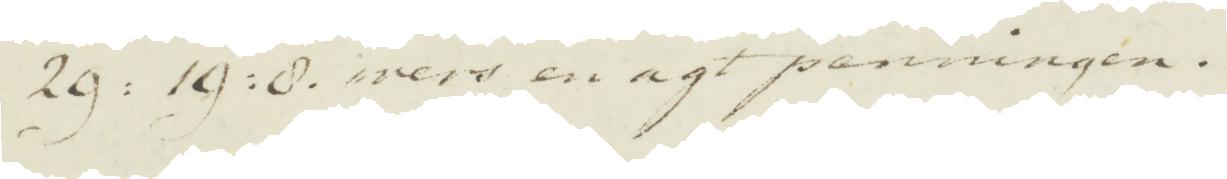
29: 19:8. „vers en agt penningen.
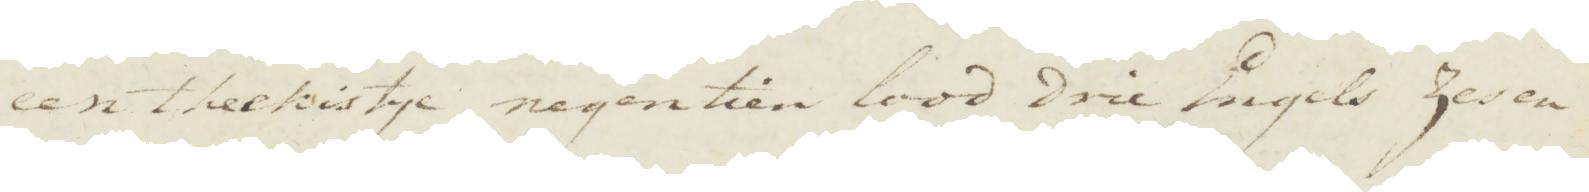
een theekistje negentien lood drie Engels zes en
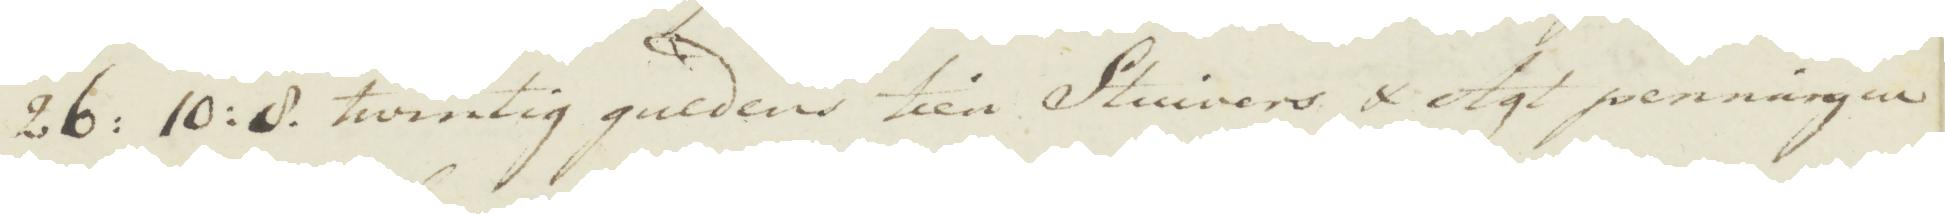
26:10:8. twintig guldens tien Stuivers & Agt penningen
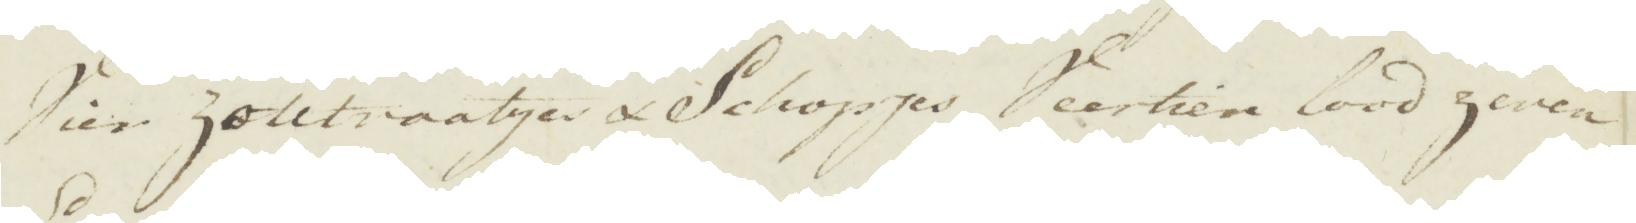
Vier zoutvaatjes & Schopjes Veertien lood zeven
